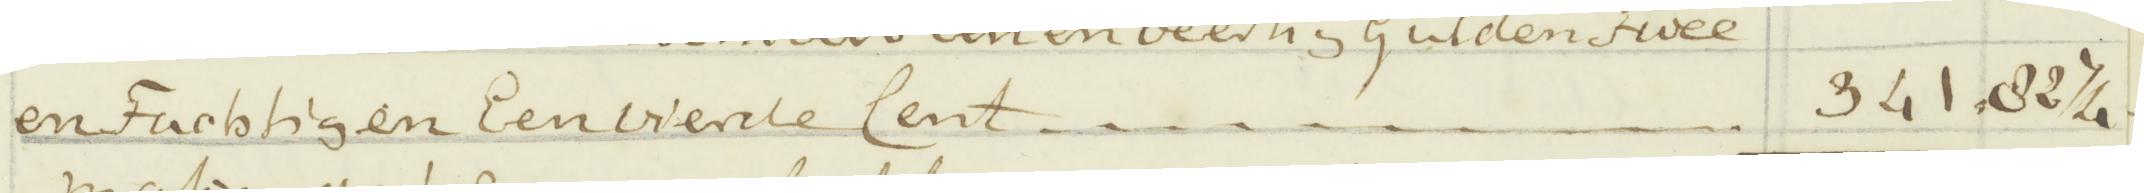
en Tachtig en Een vierde Cent.- - - - - - - - - - „ 341„ 82¼
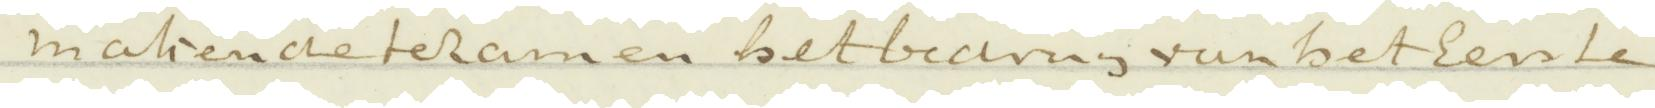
makende tezamen het bedrag van het Eerste
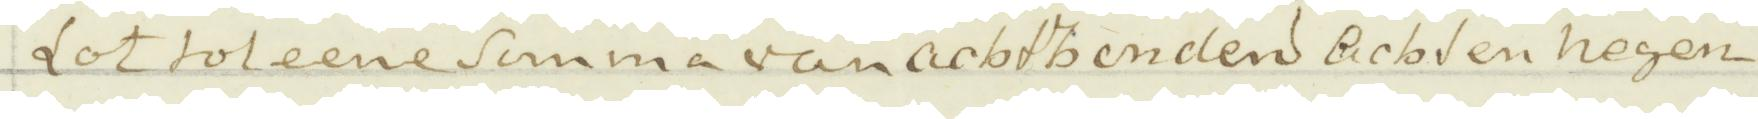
Lot tot eene somna van achthonderd Acht en negen
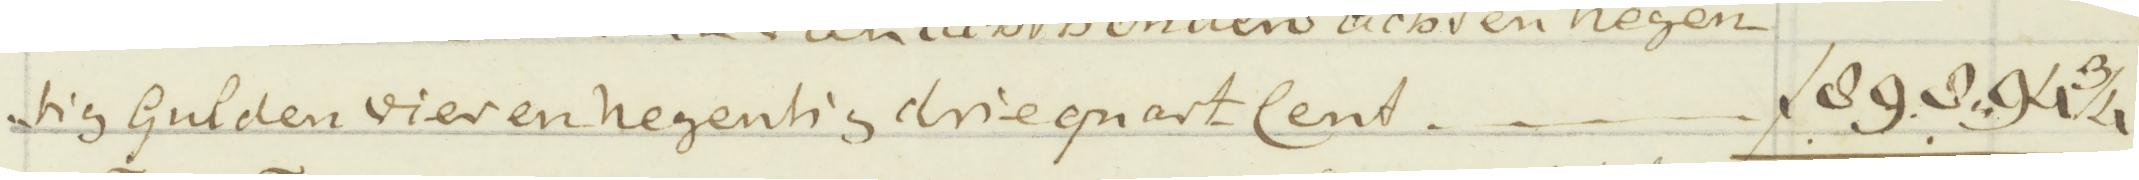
=tig gulden vier en Negentig driequart Cent - - - - - ƒ898 „ 94¾
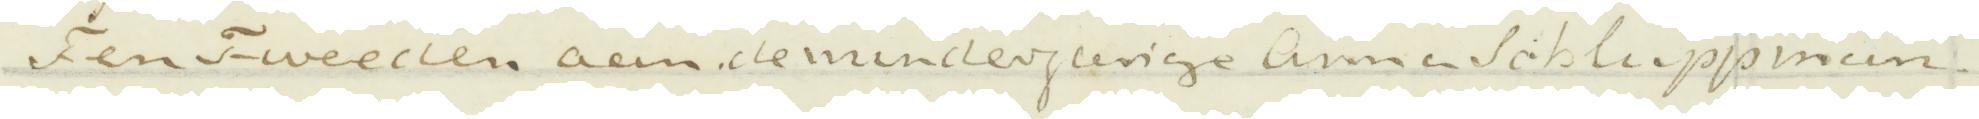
Ten Tweeden aan de minderjarige Anna Schluppman
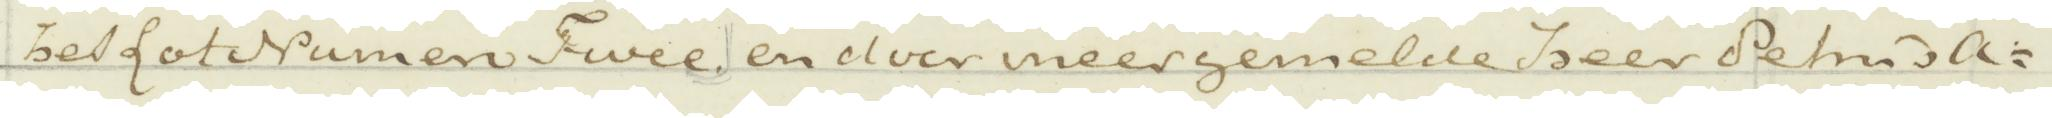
het Lot Numero Twee en door meergemelde heer Petrus A=
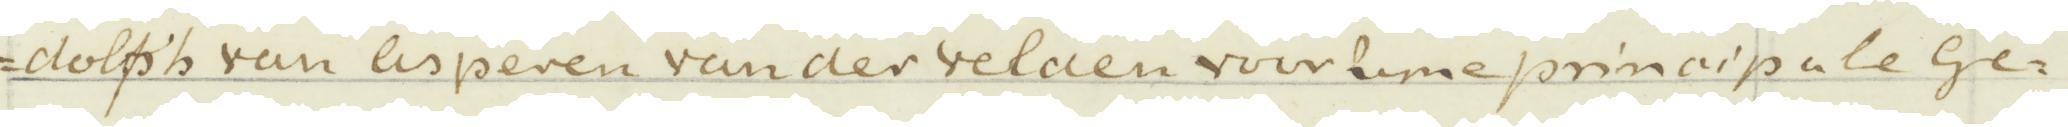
=dolph van Asperen van der velden voor Zyne principale ge„
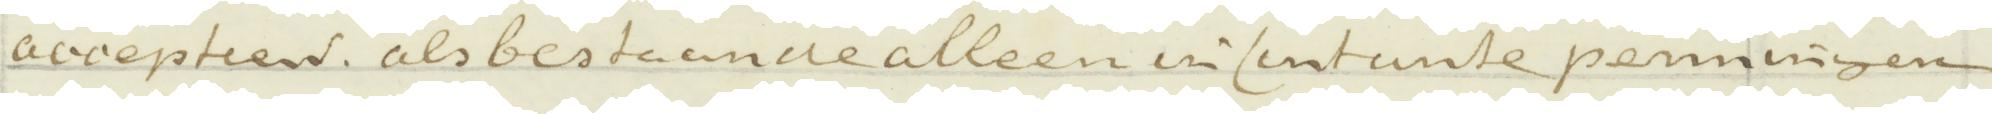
accepteerd, als bestaande alleen in Contante penningen
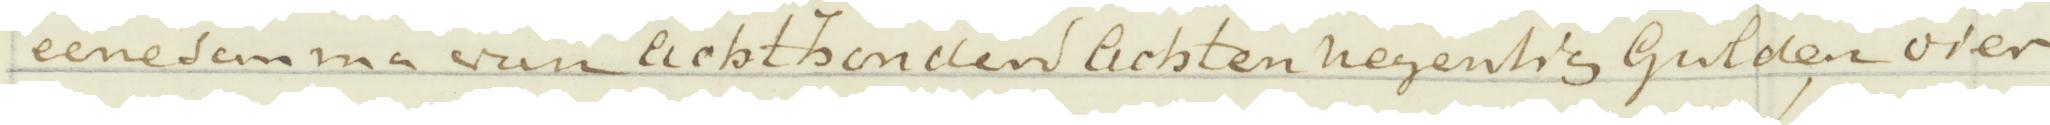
eene somma van Achthonderd Acht en negentig gulden vier
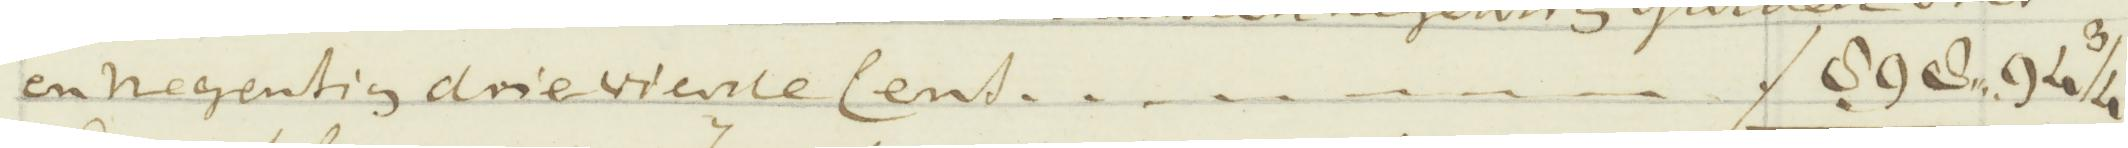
en Negentig drie vierde Cent - - - - - - - - - ƒ 898„ 94¾.
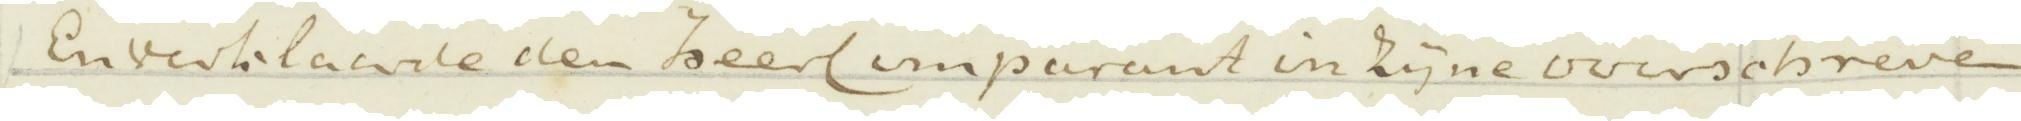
En verklaarde den Heer Comparant in Zijne voorschreve
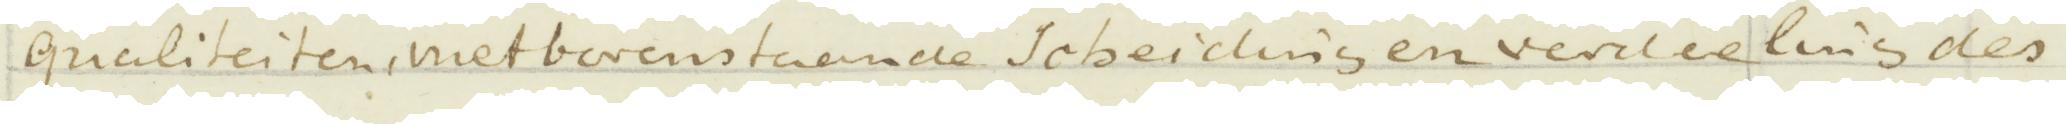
qualiteiten, met bovenstaande scheiding en verdeeling des
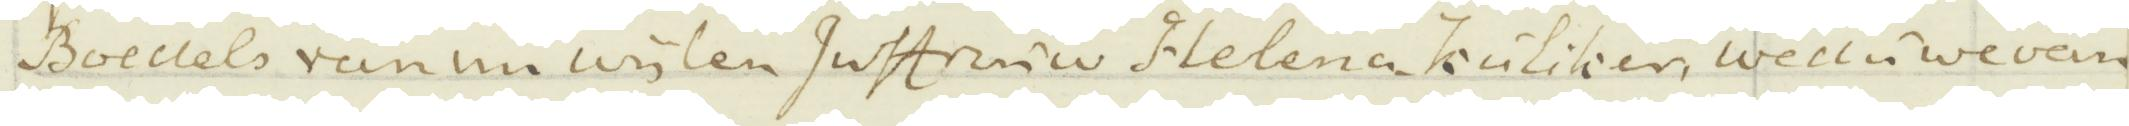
Boedels van nu wijlen Juffrouw Helena Kuliken weduwe van
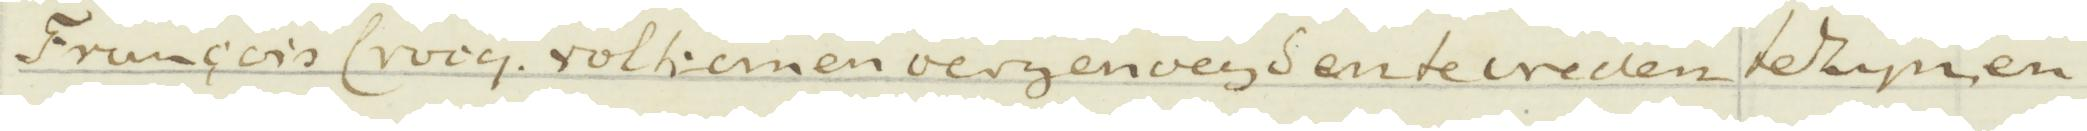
François Crooq, volkomen vergenoegd en tevreden te Zyn, en
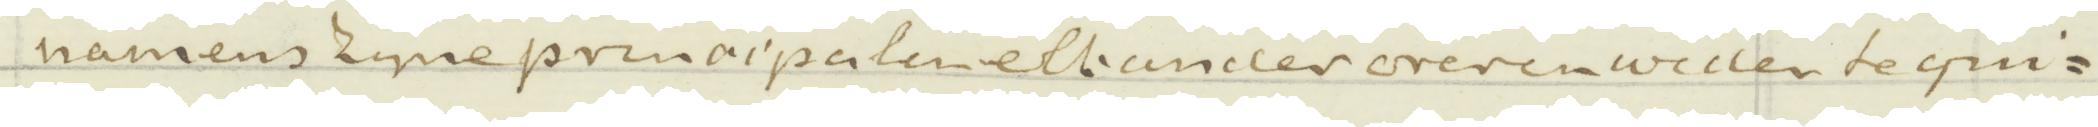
namens Zyne principalen elkander over en weder te qui=
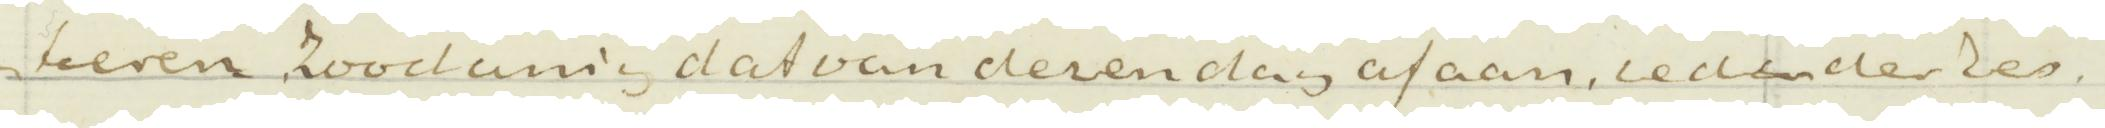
=teeren Zoodanig dat van dezen dag af aan ieder der res„
